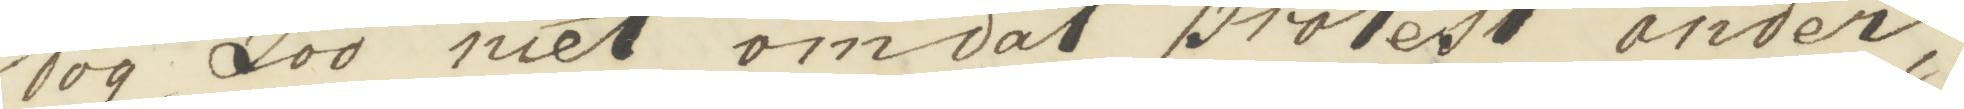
dog zoo niet omdat protest ander„
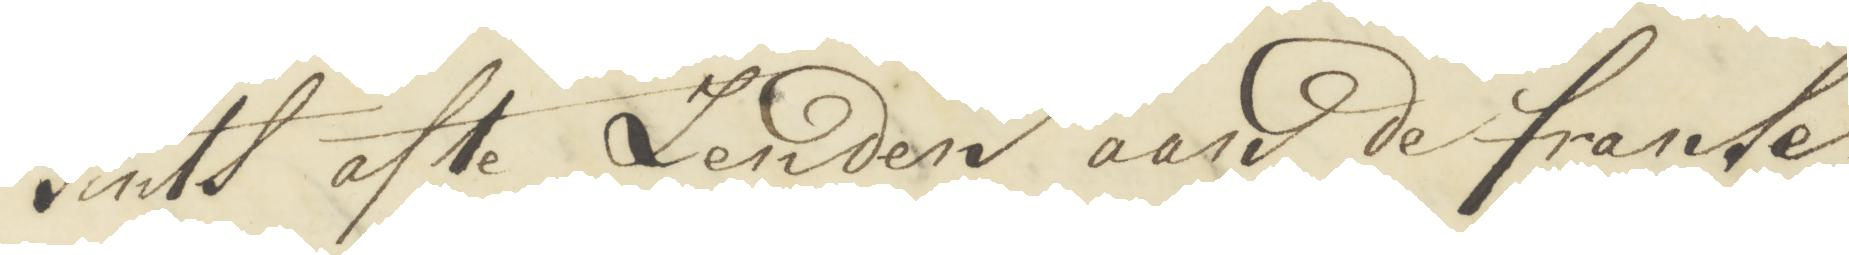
sints af te zenden aan de franse
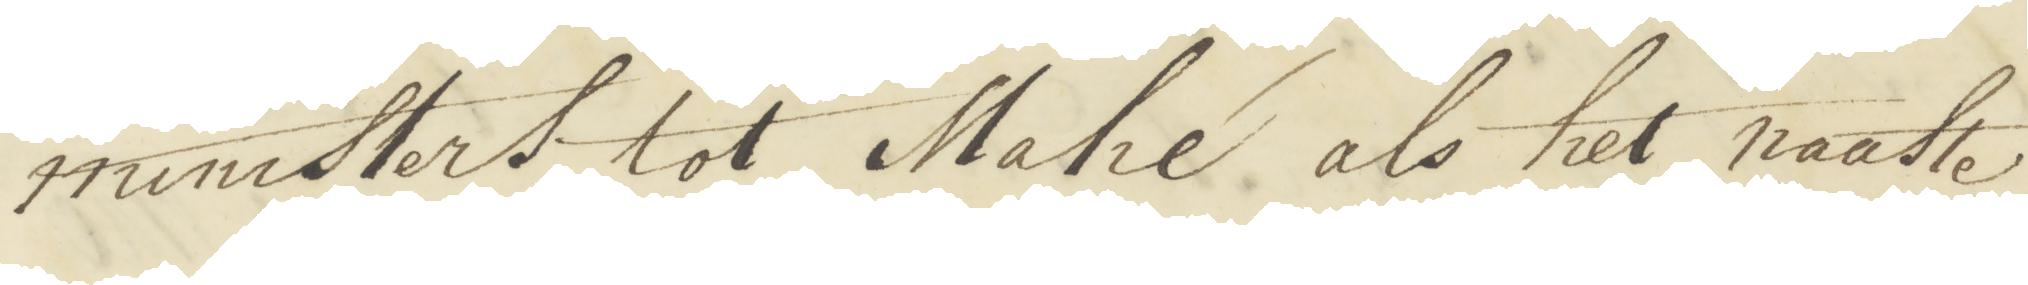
ministers tot Mahé als het naaste
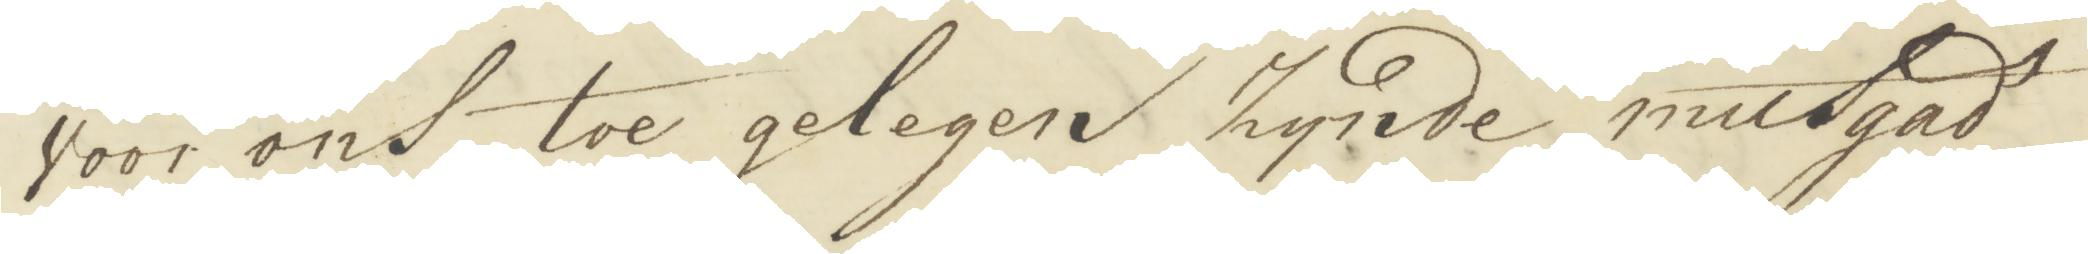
voor ons toe gelegen zynde mitsgads
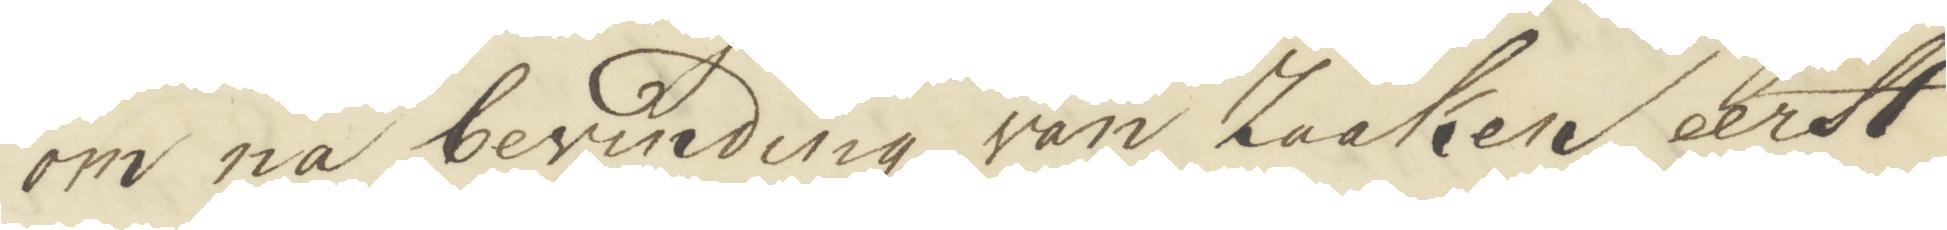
om na bevinding van zaaken eerst
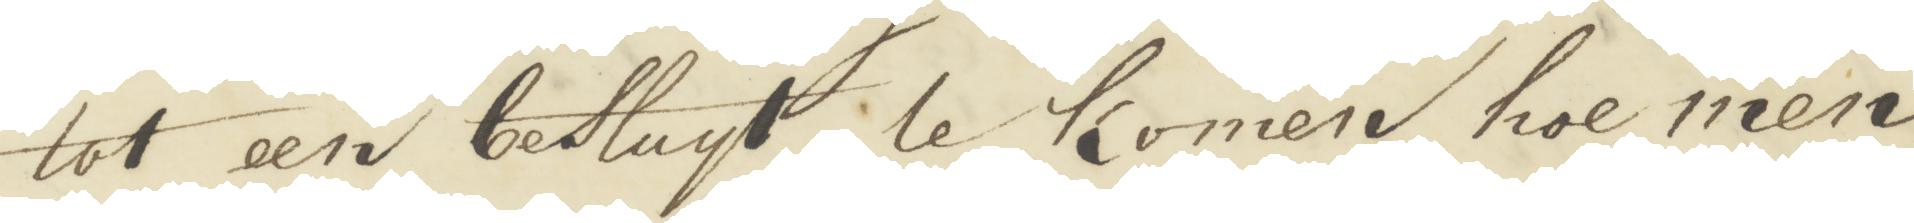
tot een besluyt te komen hoe men
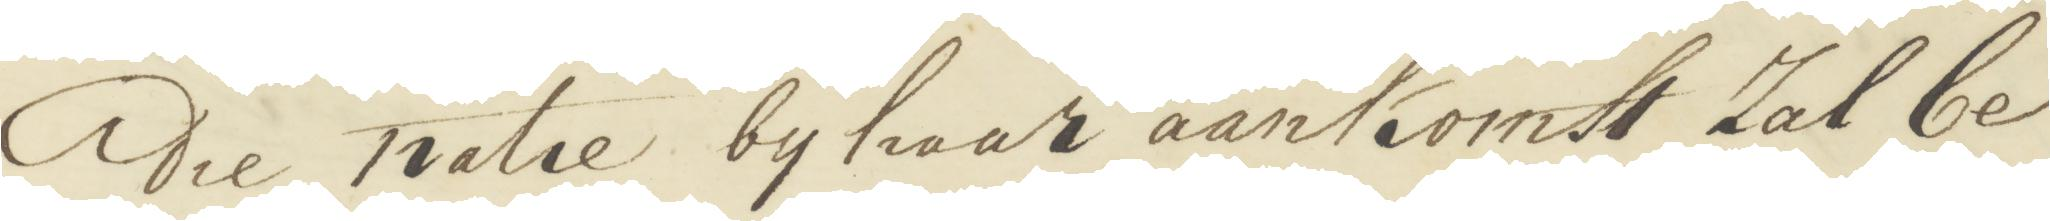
die natie by haar aankomst zal be
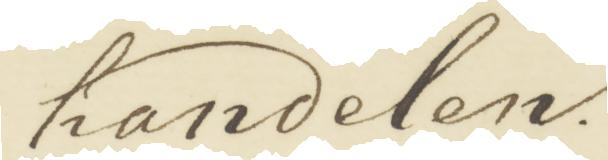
handelen.
